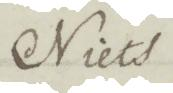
Niets
